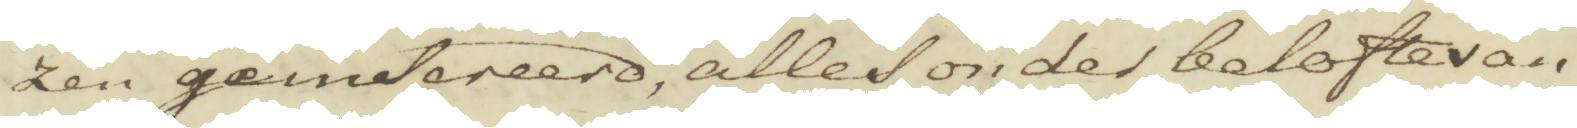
zen geinsereerd, alles onder belofte van
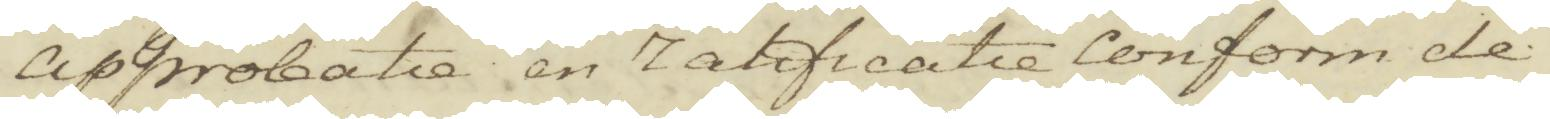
approbatie en ratificatie conform de
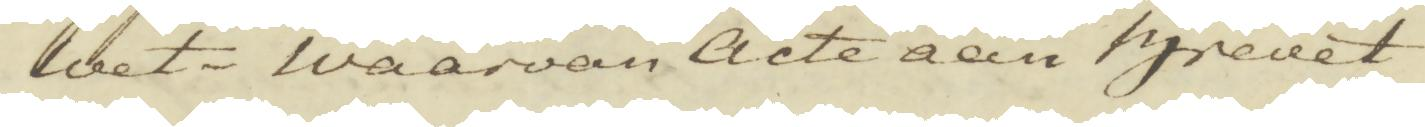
wet– Waarvan Acte aan Brevet
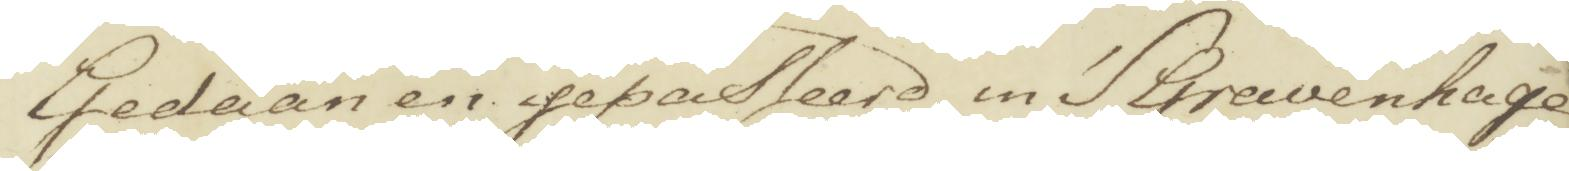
Gedaan en gepasseerd in 's Gravenhage
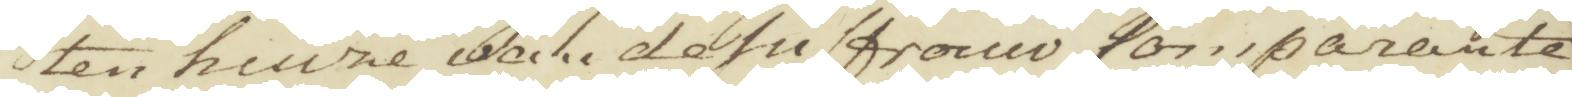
ten huize van de Juffrouw Comparente
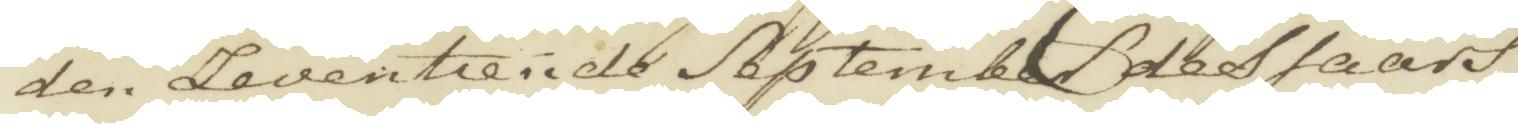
den zeventiende September des jaars
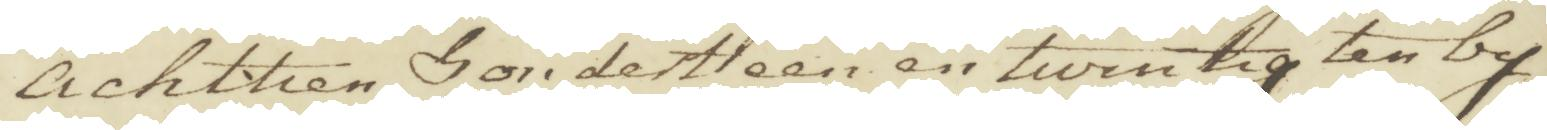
achttien hondert een en twintig ten by
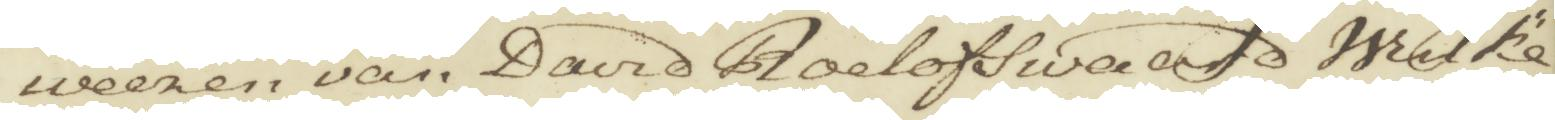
weezen van David Roelofswaard Winke
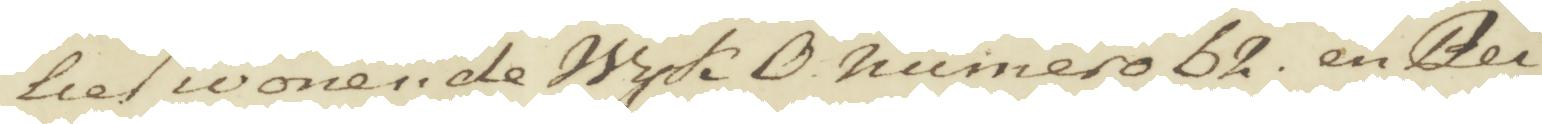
lier wonende Wyk O. numero 62. en Rei
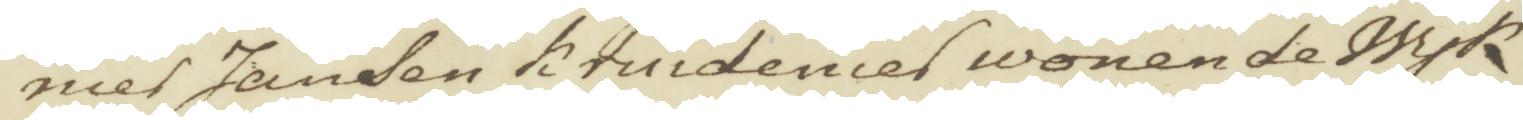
nier Jansen kruidenier wonende Wyk
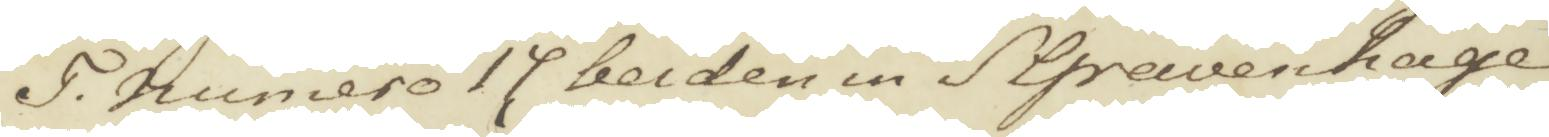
T. numero 17 beiden in 's Gravenhage
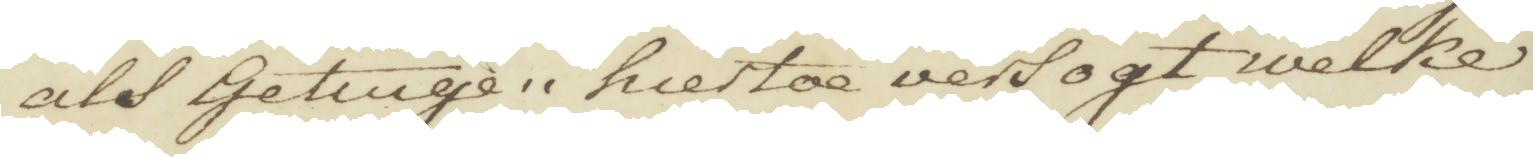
als Getuigen hiertoe versogt welke
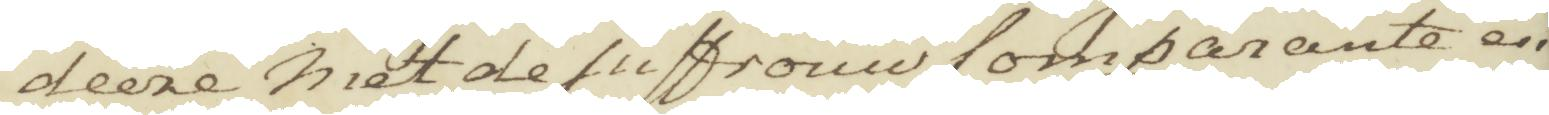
deeze met de juffrouw Comparante en
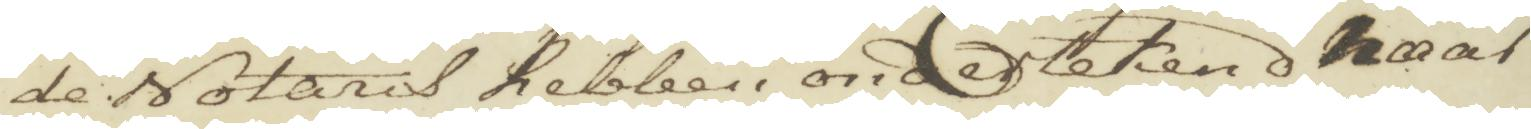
de Notaris hebben ondertekend naar
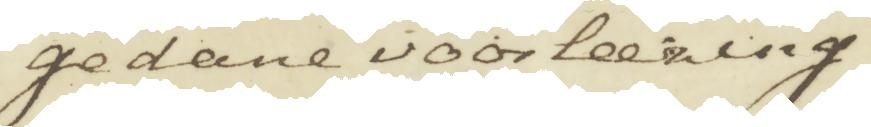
gedane voorleezing
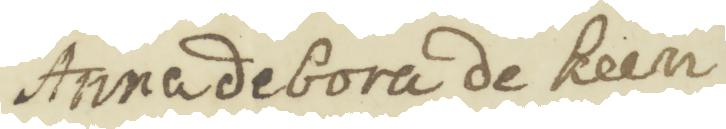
Anna debora de keen
